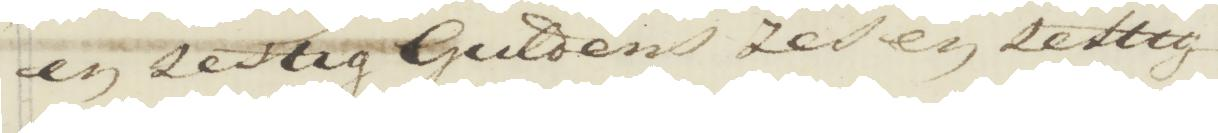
en zestig Guldens zes en zestig
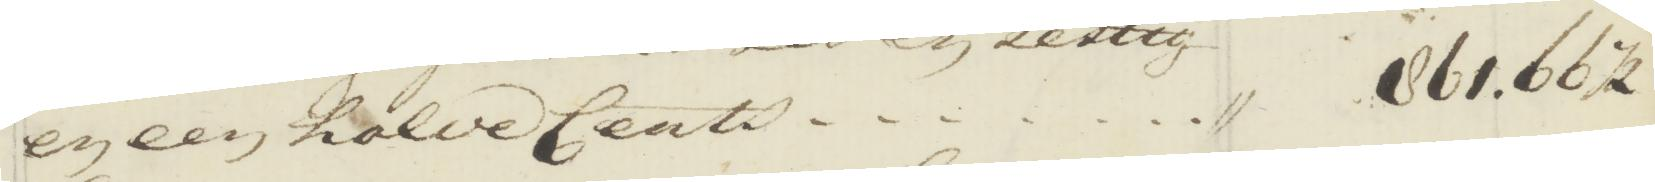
en een halve Cents . . . . . . . „ 861. 66½
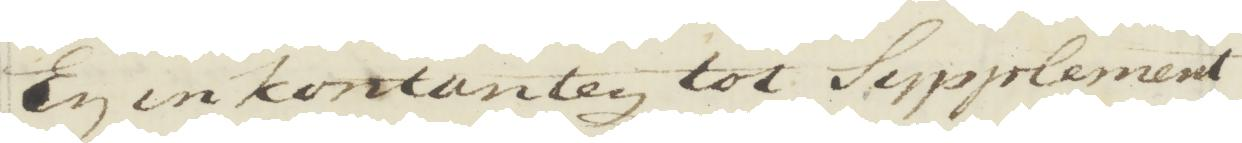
en in kontanten tot supplement
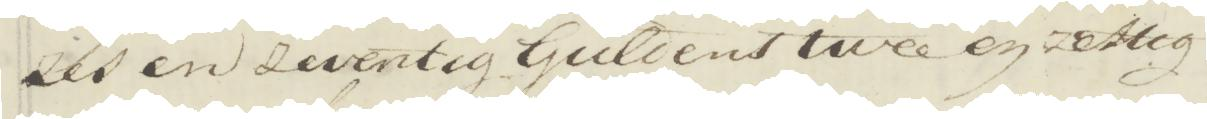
zes en zeventig Guldens twee en zestig
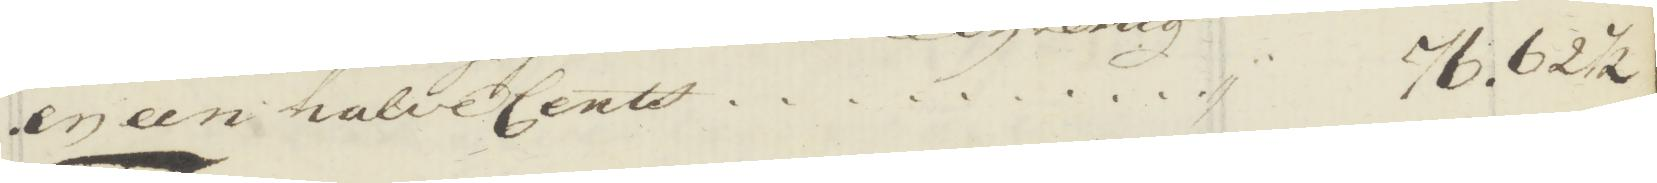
en een halve Cents . . . . . . . . . . „ 76. 62½
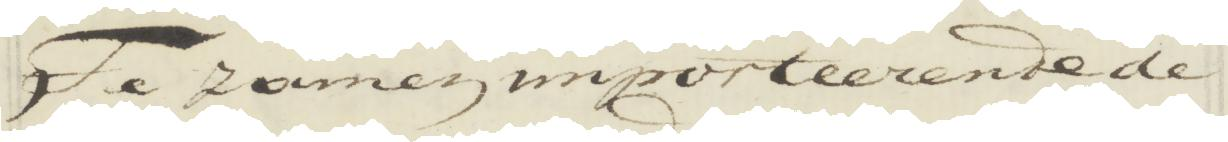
Te zamen importeerende de
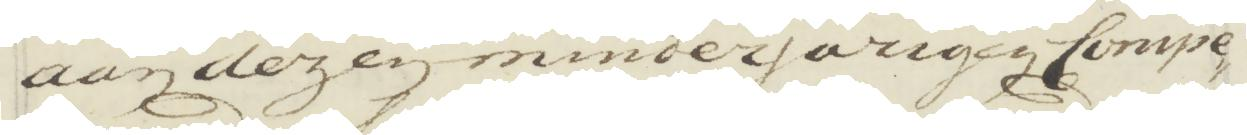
aan dezen minderjarigen Compe„
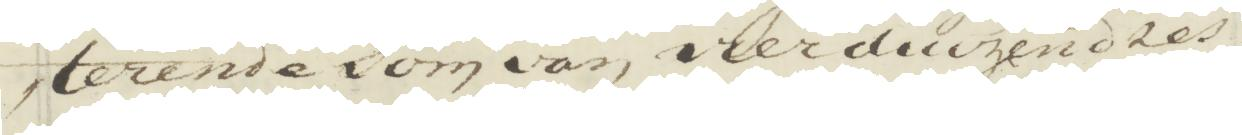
„terende som van vierduizend zes
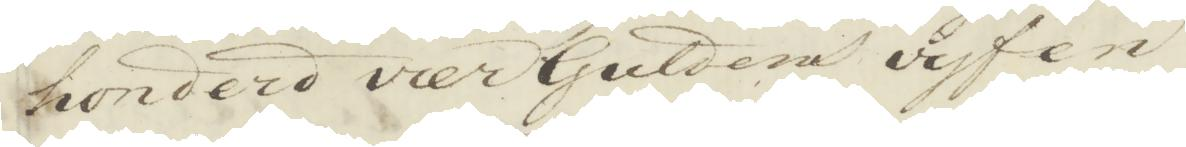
honderd vier Guldens vyfen
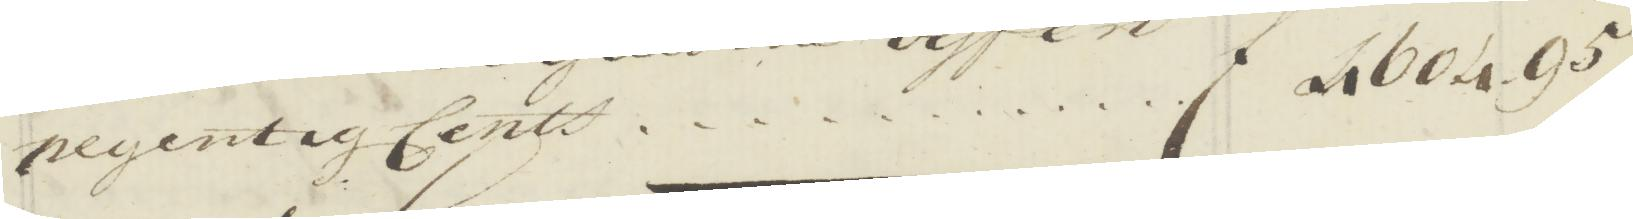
negentig cents . . . . . . . . . . . . ƒ 4604. 95
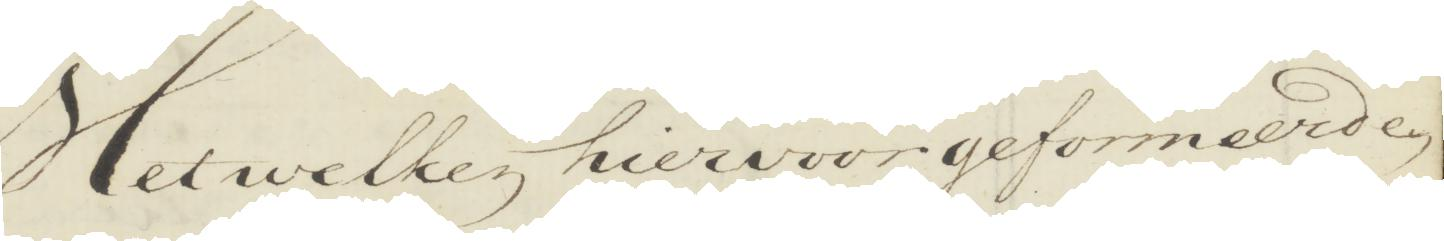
Met welken hiervoor geformeerd en
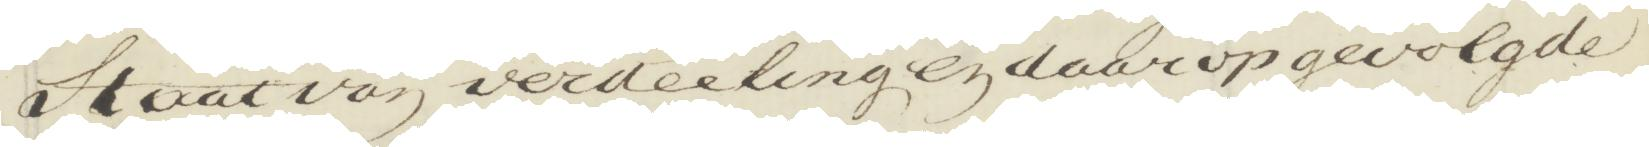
staat van verdeeling en daarop gevolgde
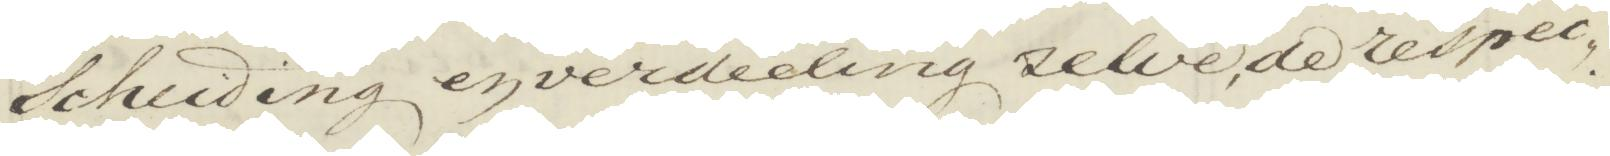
scheiding en verdeeling zelve, de respec„
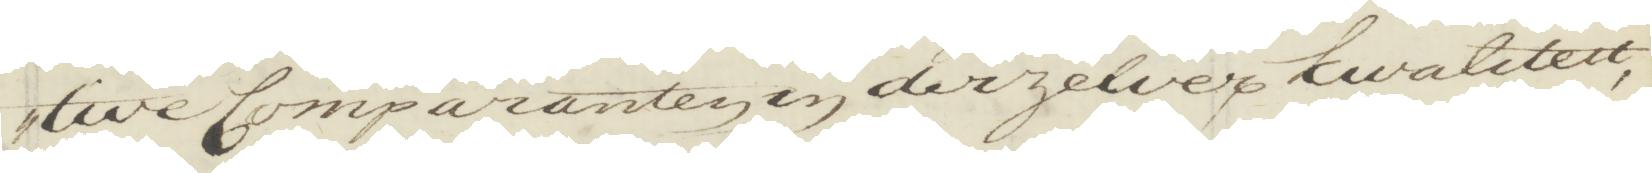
„tive Comparanten in derzelver kwaliteit,
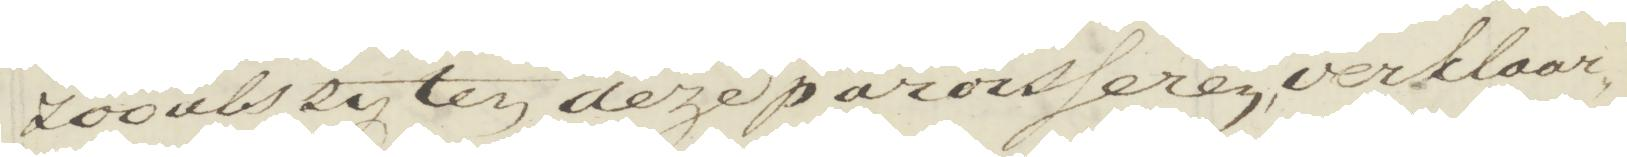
zoo als zy ten deze paroisseren verklaar„
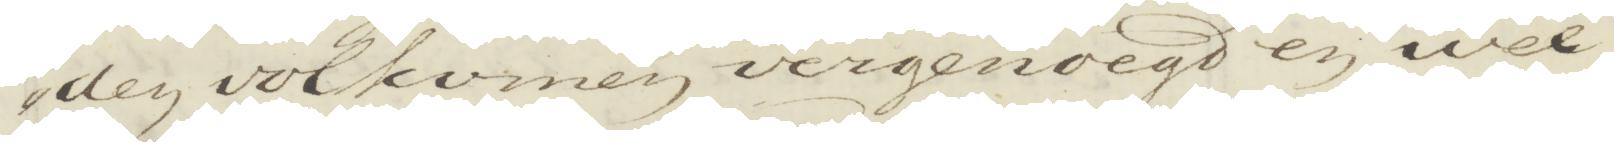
den volkomen vergenoegd en wel
